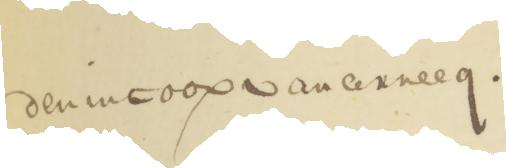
den incoop van arreeq.
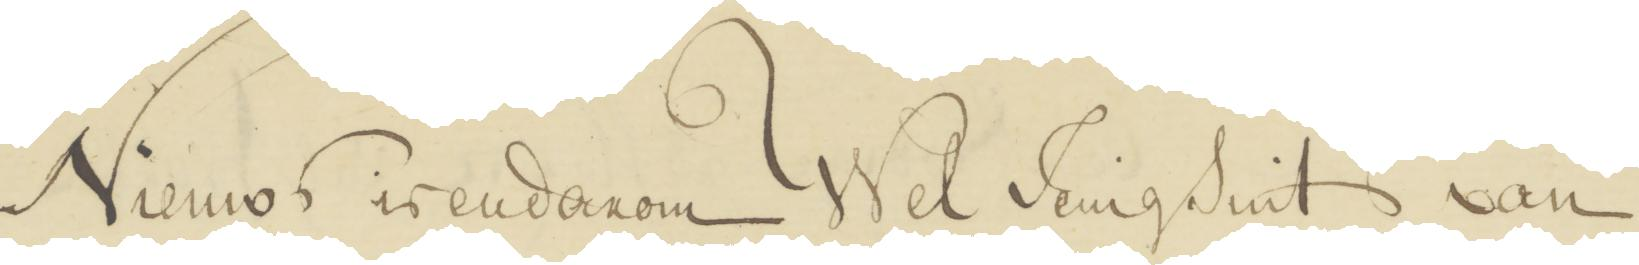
Nieuws is en darom Wel Eenigsints van
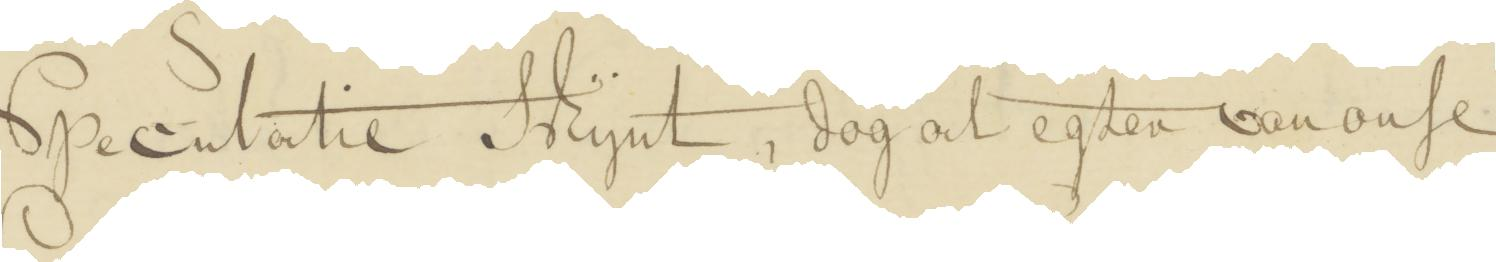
speculatie schijnt, dog al egter van onse
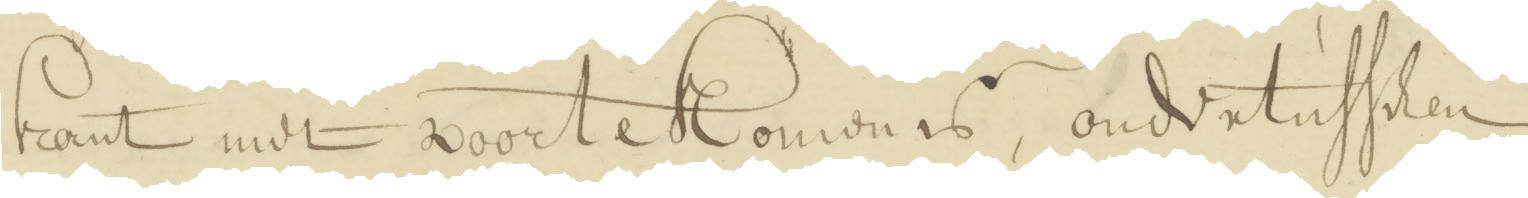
kant niet voorte Komen is, ondertusschen
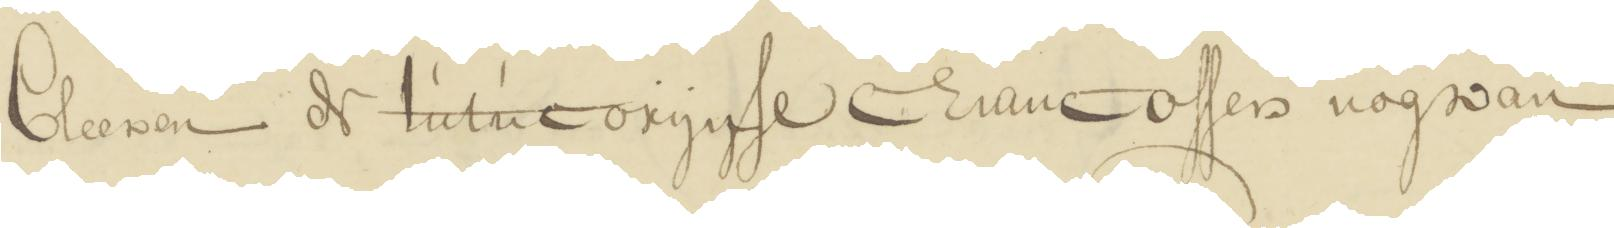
Cleeven de tutucorijnse chiancossers nog van
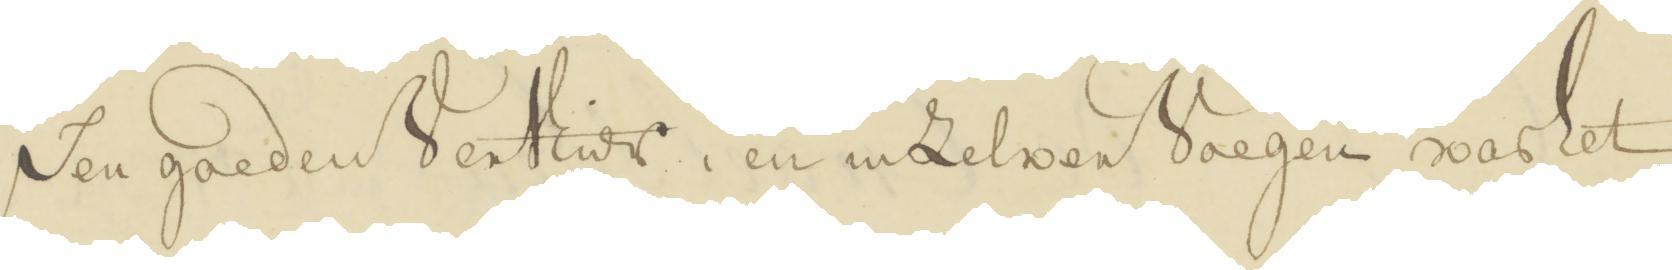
Een goeden verthier, en inzelver Voegen was het
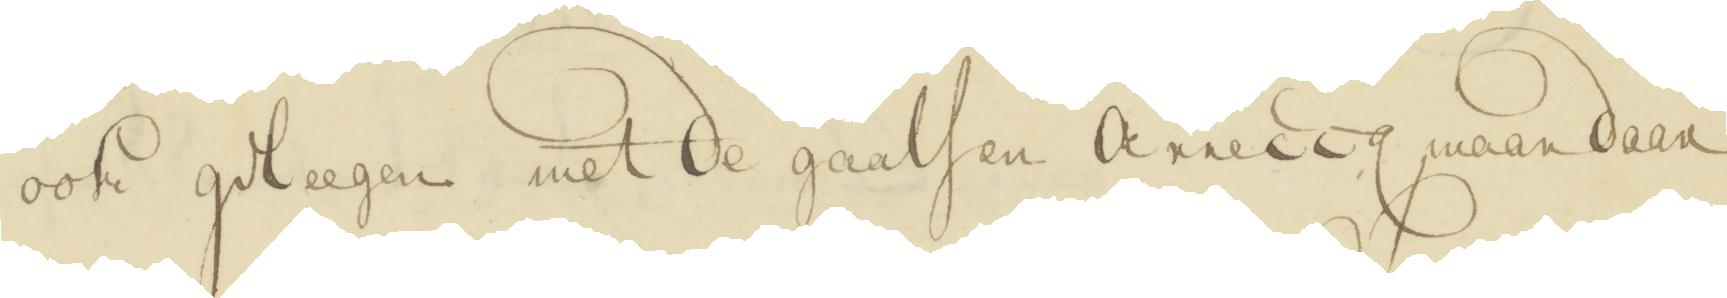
ook geleegen met de gaalsen Arreecq, maar daar
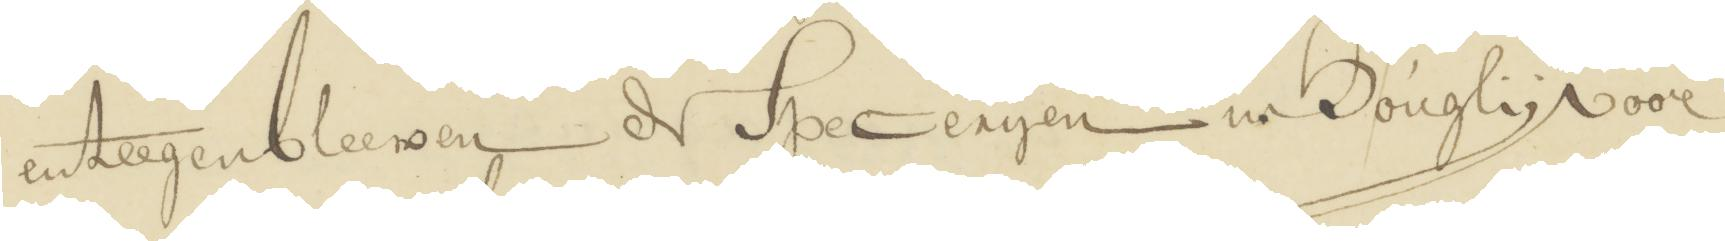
enteegen bleeven de Specerijen in Houglij voor
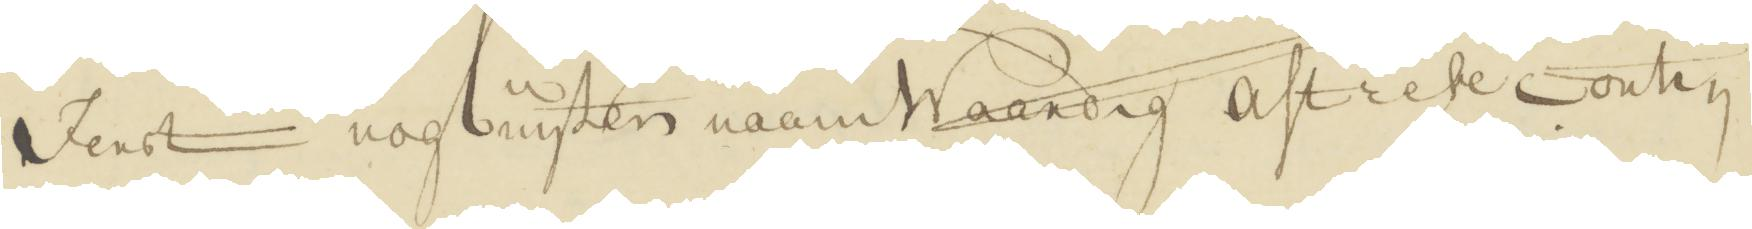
Eerst nog buijten naamWaardig aftrek conti
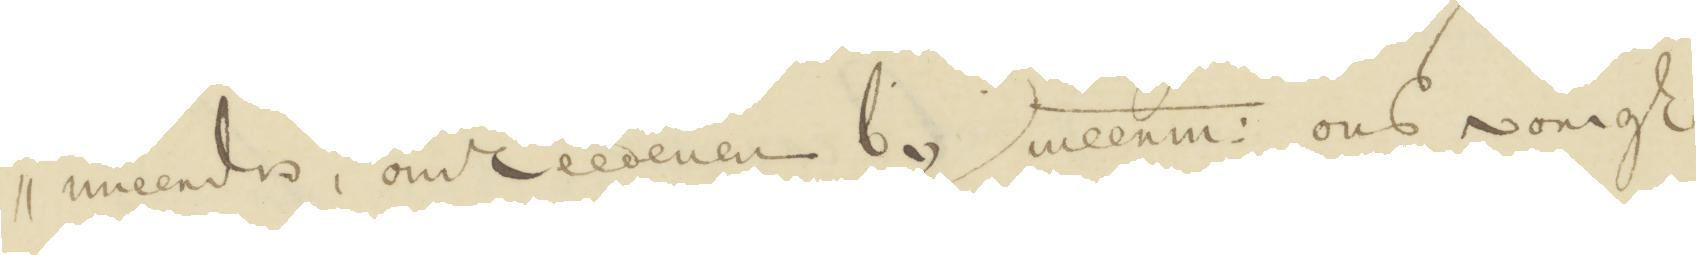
„nueeren, om reedenen bij meerm: ons vorigh
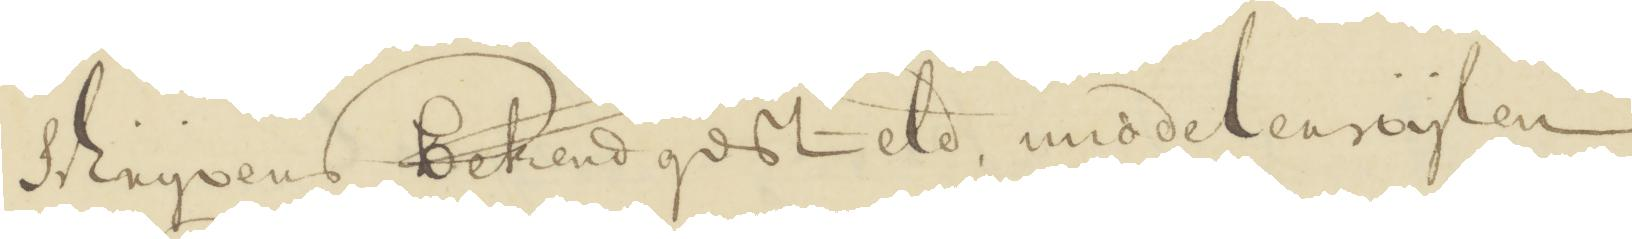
schrijvens bekend gesteld, middelerwijlen
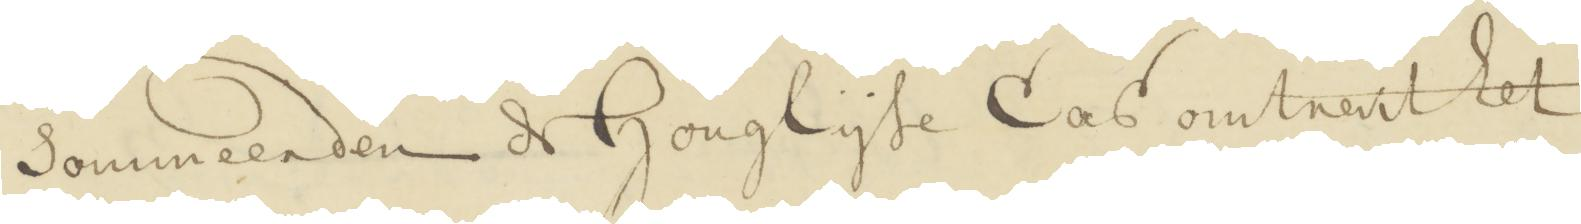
sommeerden de Houglijse Cas omtrent het
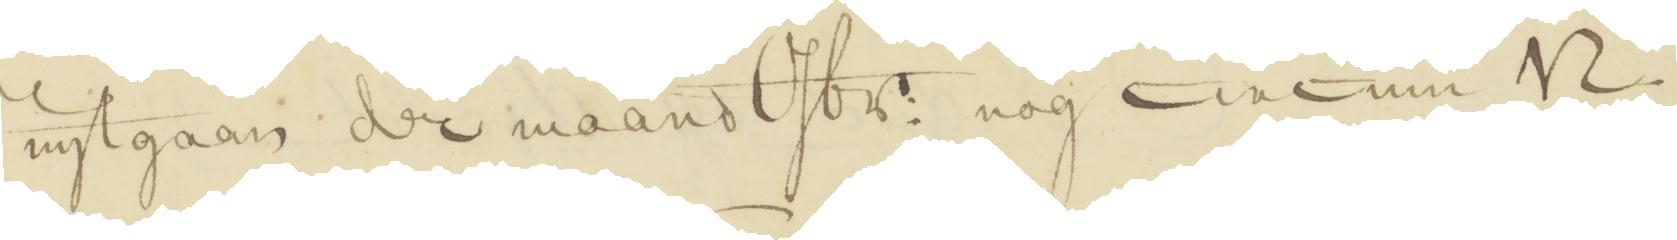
uijtgaan der maand Fbr: nog circum 12.
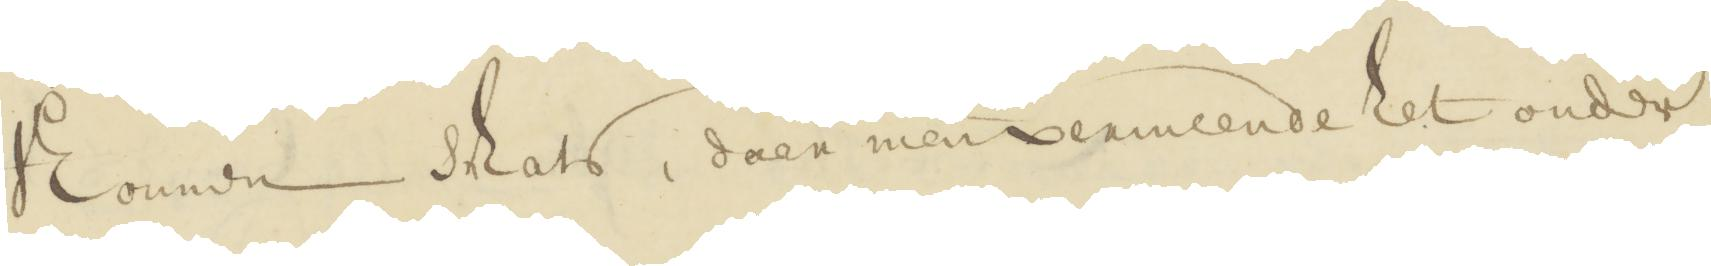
Tonnen schats, daar men vermeende het onder
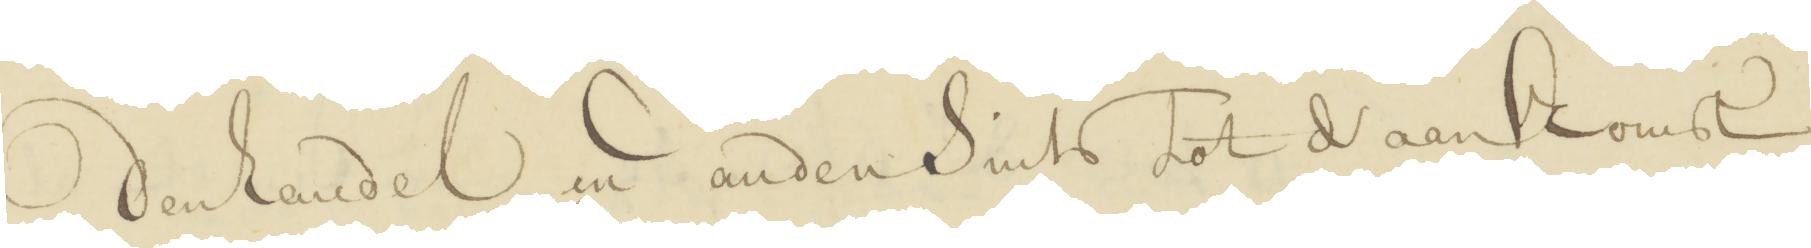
den handel, en ander Sints tot de aanKomst
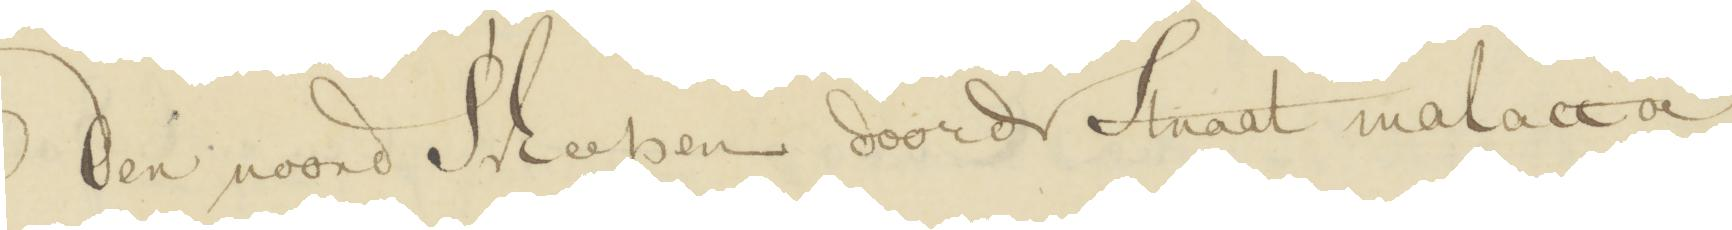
der noord Scheepen door de Straat malacca
